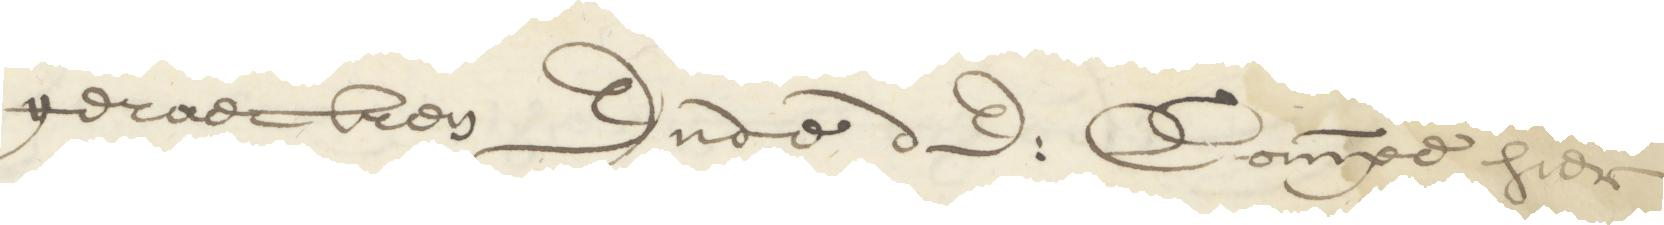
geraecken Ende d E: Compe hier
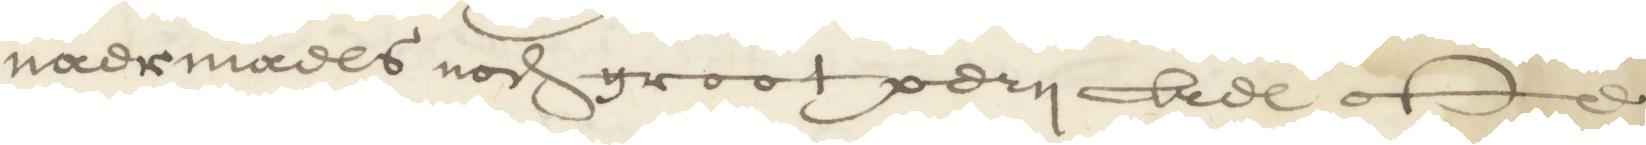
naermaels noch groot peryckel offe
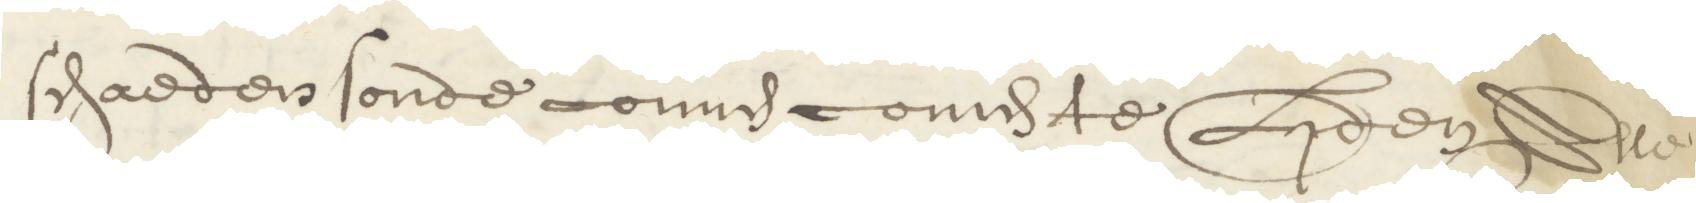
schaeden soude connen comen te Lyden Alle
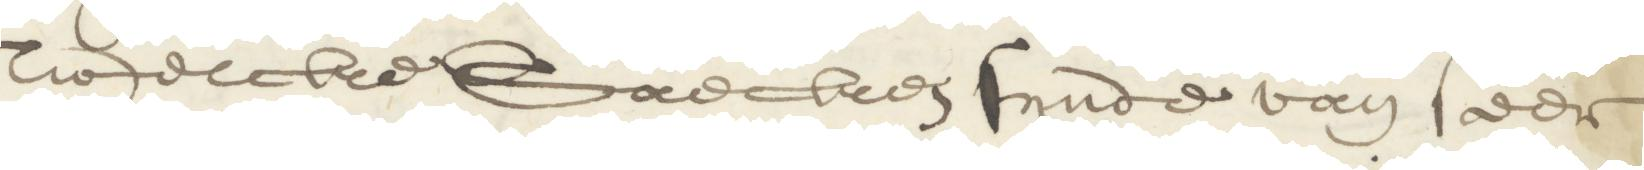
welcke Saecken synde van seer
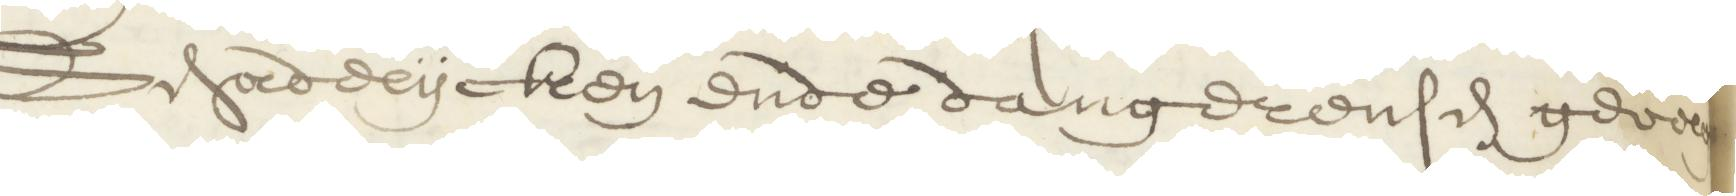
Schadelijcken ende dangereuschen gevoe
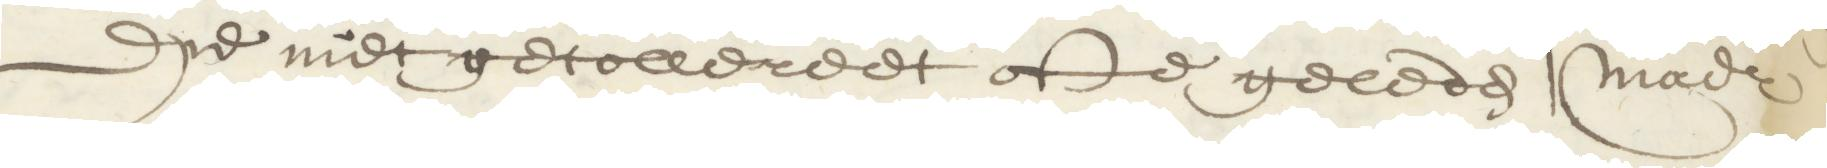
die niet getollereet ofte geleden maer
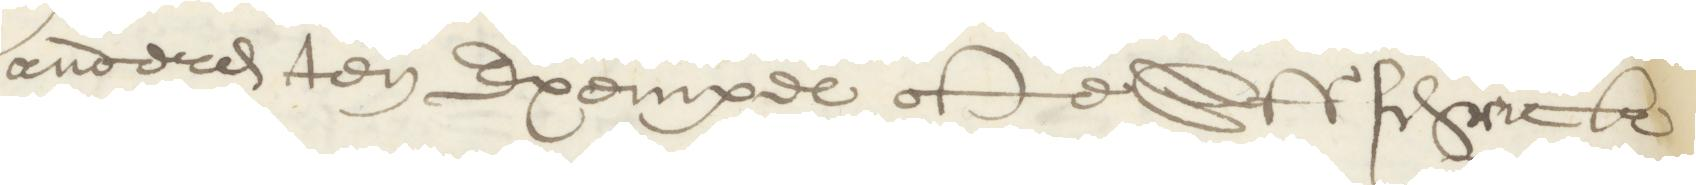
anderen ten Exempel ofte Afschrick
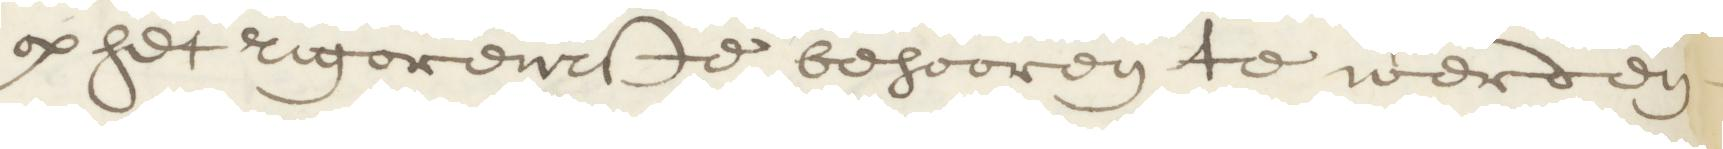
op het rigoreurste behooren te werden
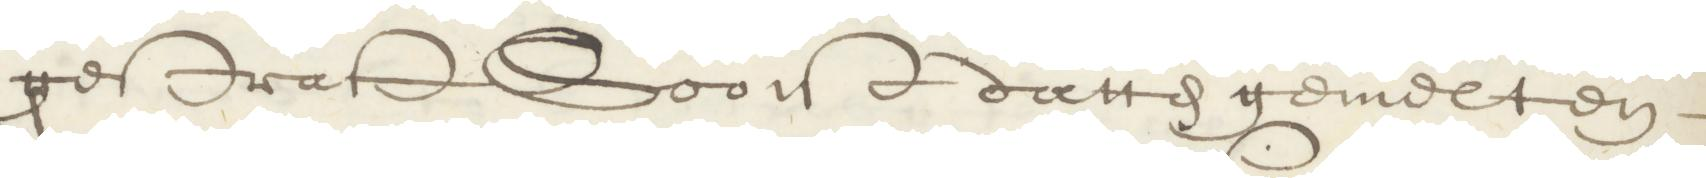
gestraft hoort datten gemelten
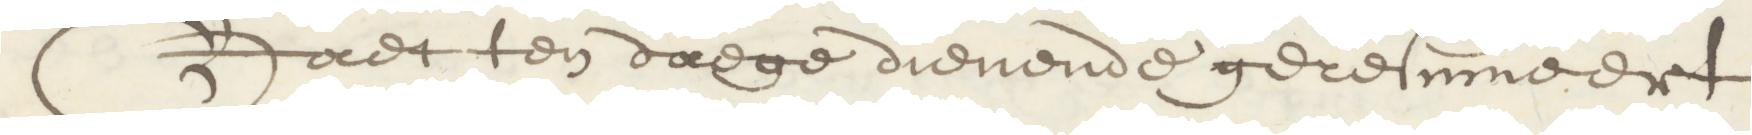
Gaet ten daege dienende geresumeert
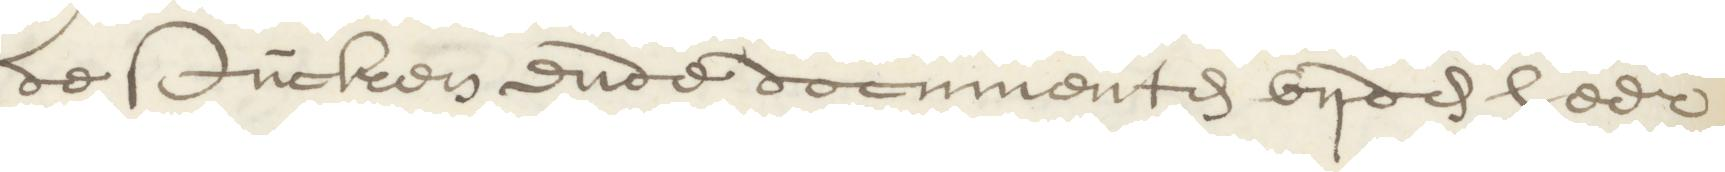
de stucken ende documenten by den heer
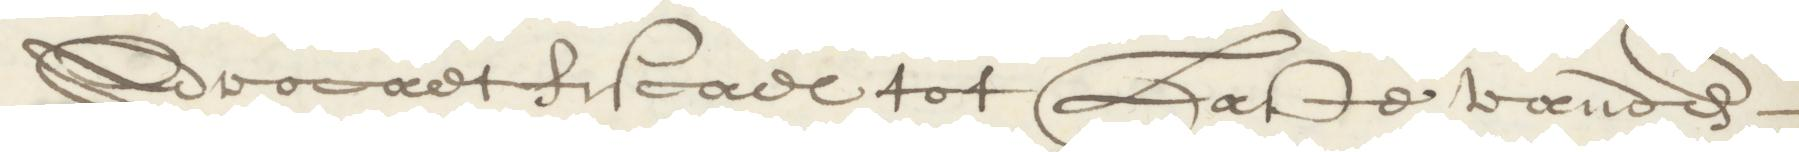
Advocaet fiscael tot Laste vanden
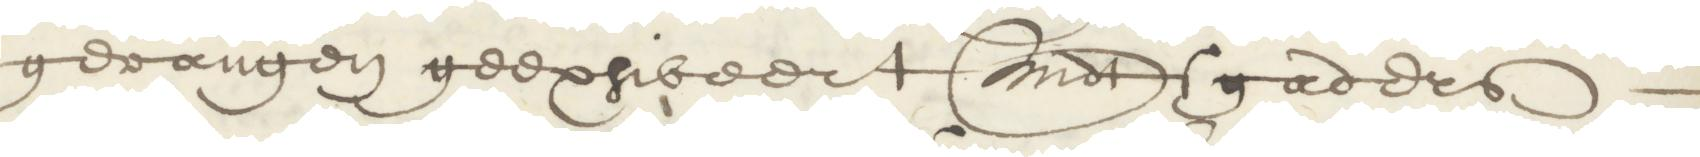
gevangen geexhibeert mitsgaders
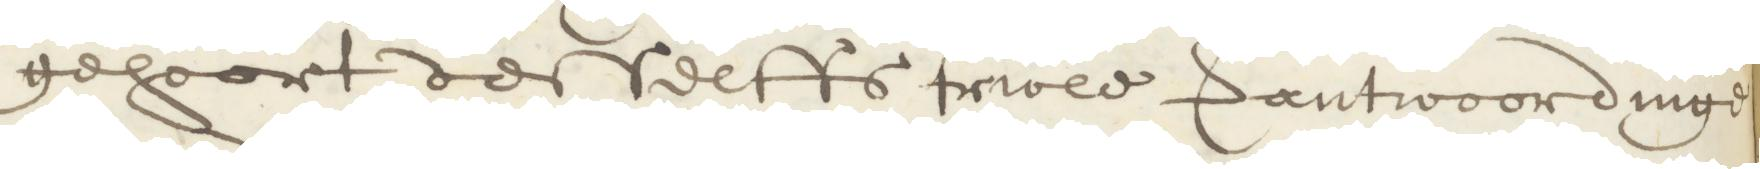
gehoort desselffs friole verantwoordinge
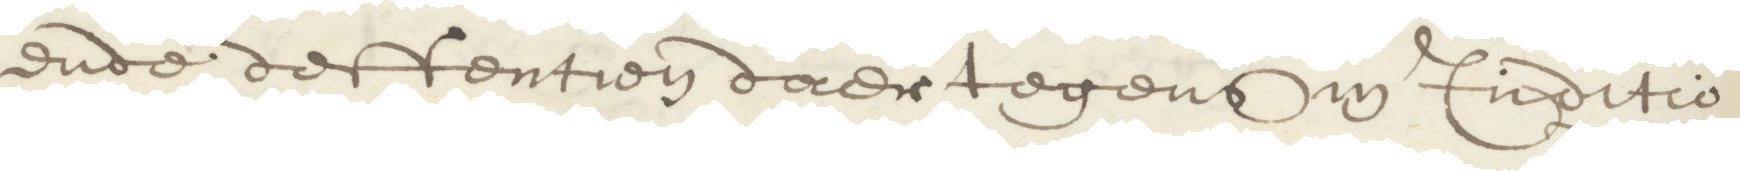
ende deffentien daer tegens om Juditio
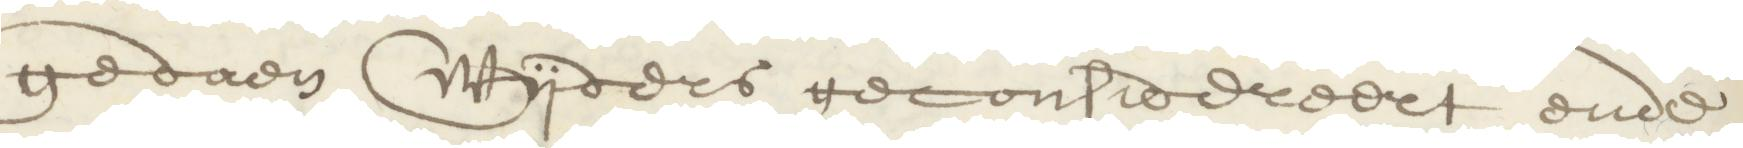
gedaen wijders geconsidereert ende
